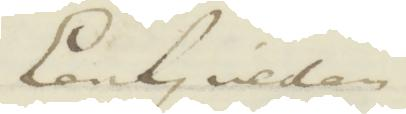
EenGulden
